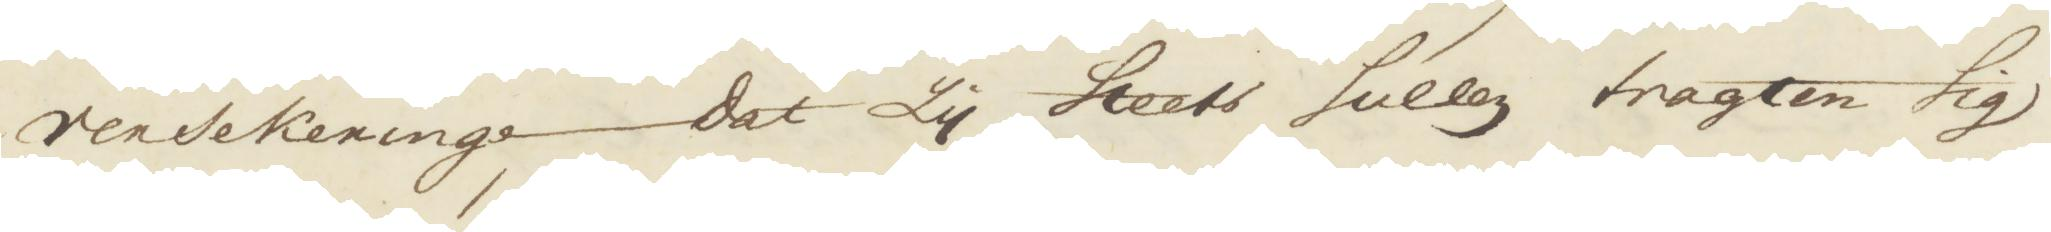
versekeringe dat zij steets sullen tragten sig
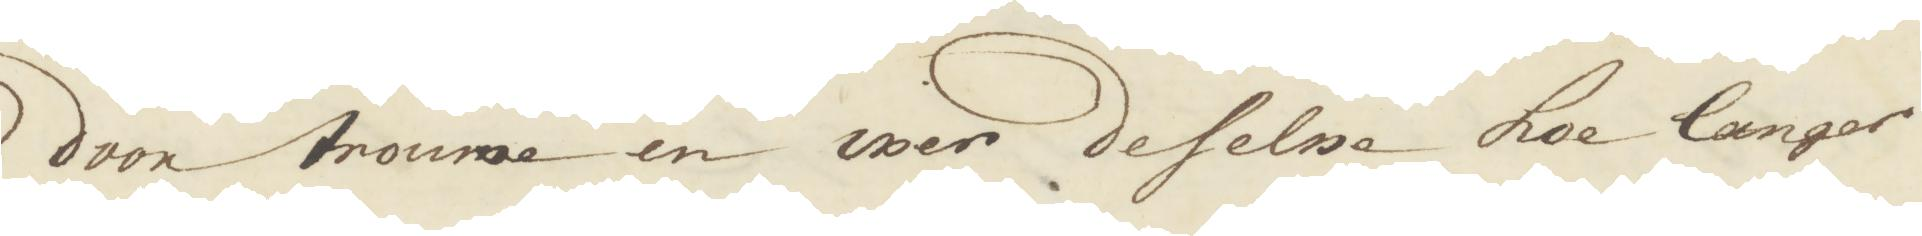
door trouwe en iver deselve hoe langer
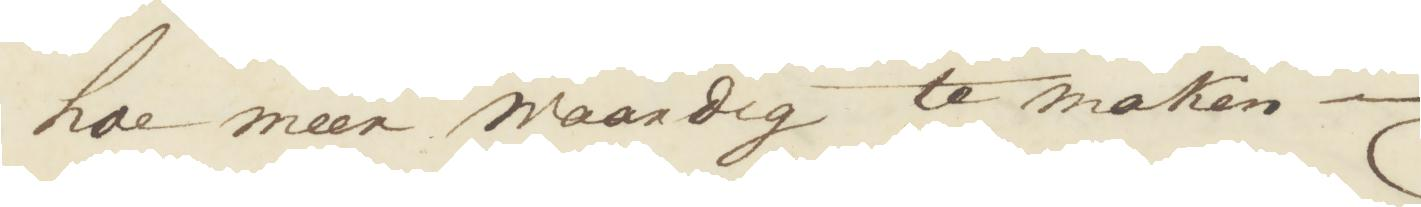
hoe meer waardig te maken-
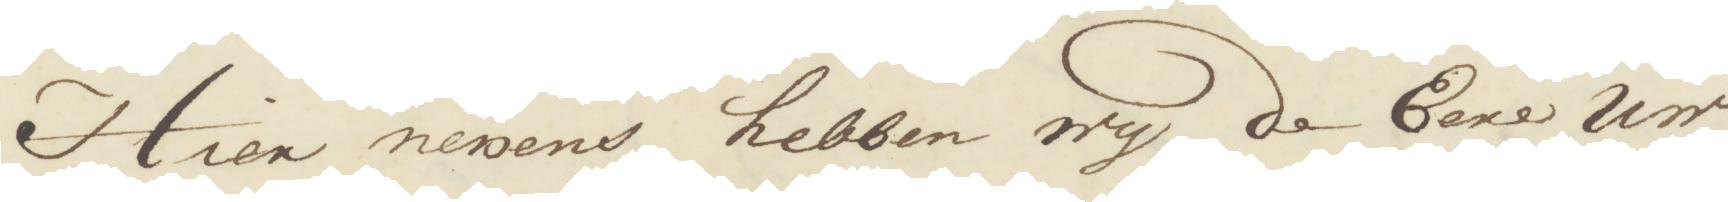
Hier nevens hebben wij de Eere uw
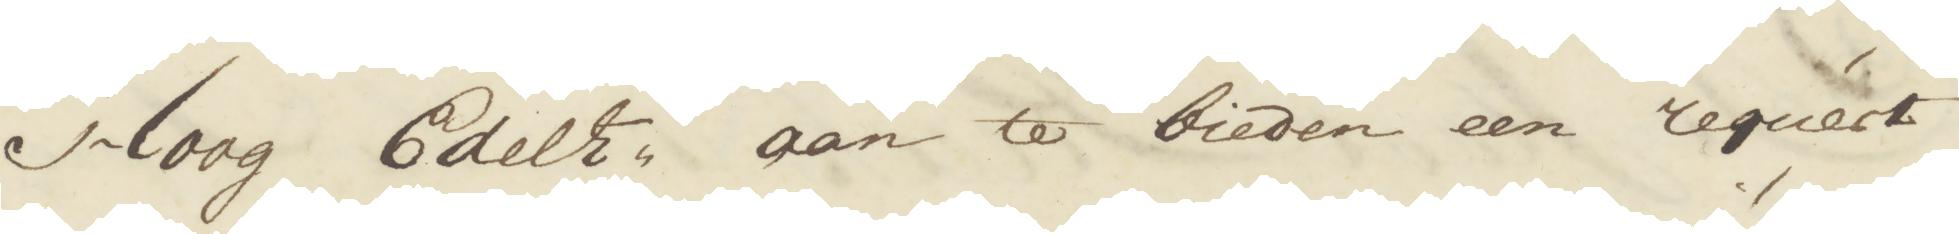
Hoog Edelh„s aan te bieden een request
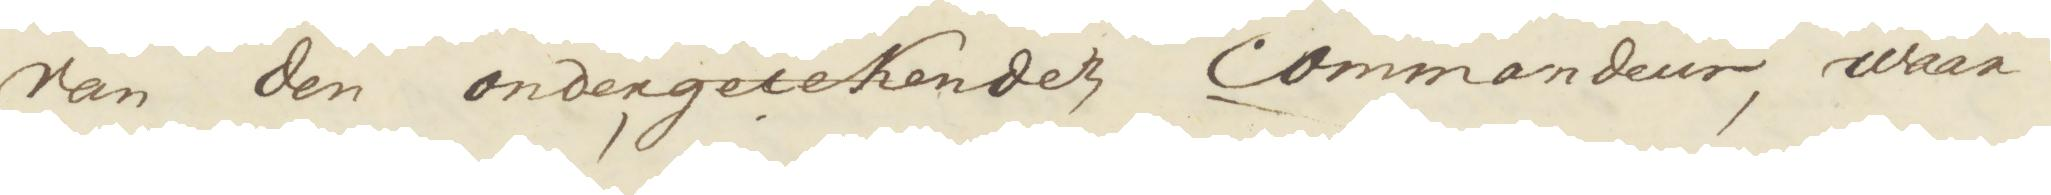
van den ondergetekenden Commandeur, waar
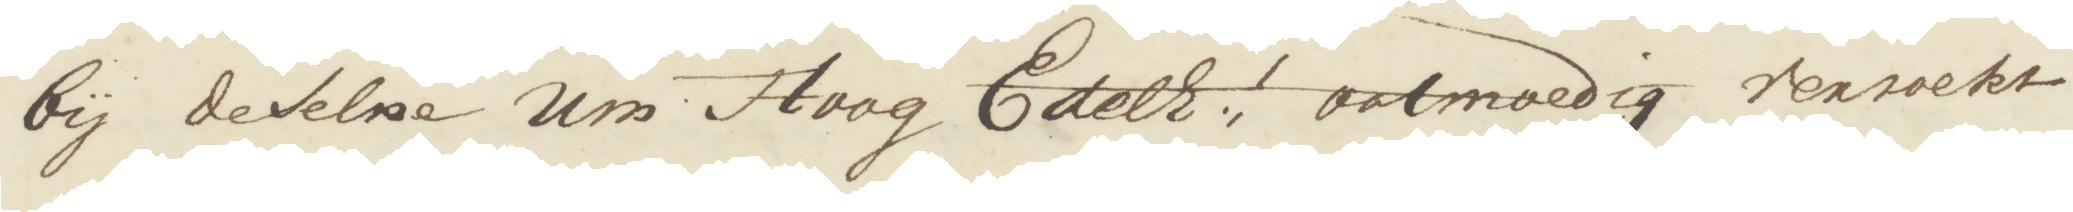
bij deselve uw Hoog Edelh;t ootmoedig versoekt
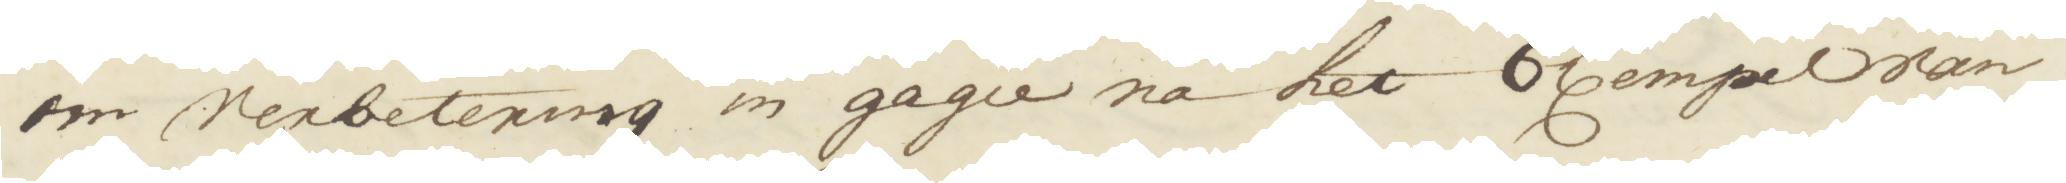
om verbetering in gagie na het Exempel van
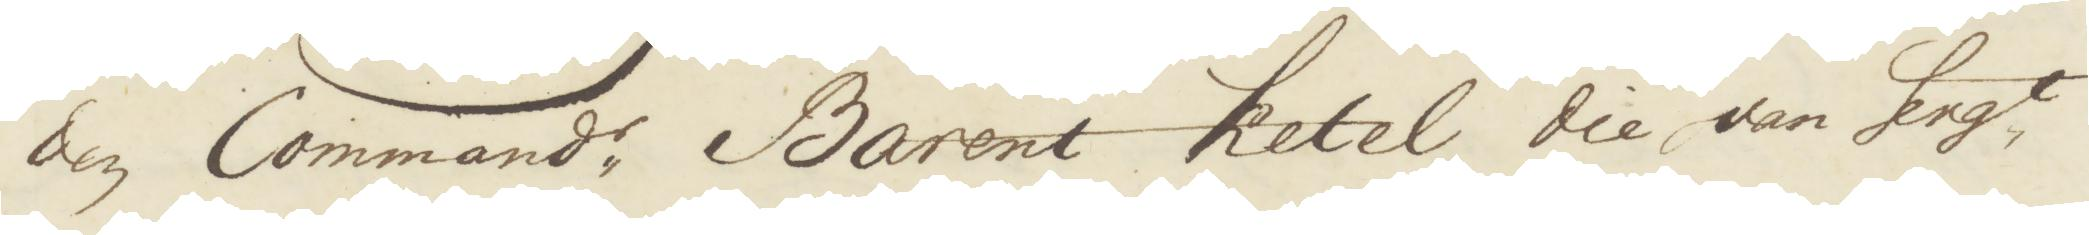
den Command„r Barent ketel die van serg„t
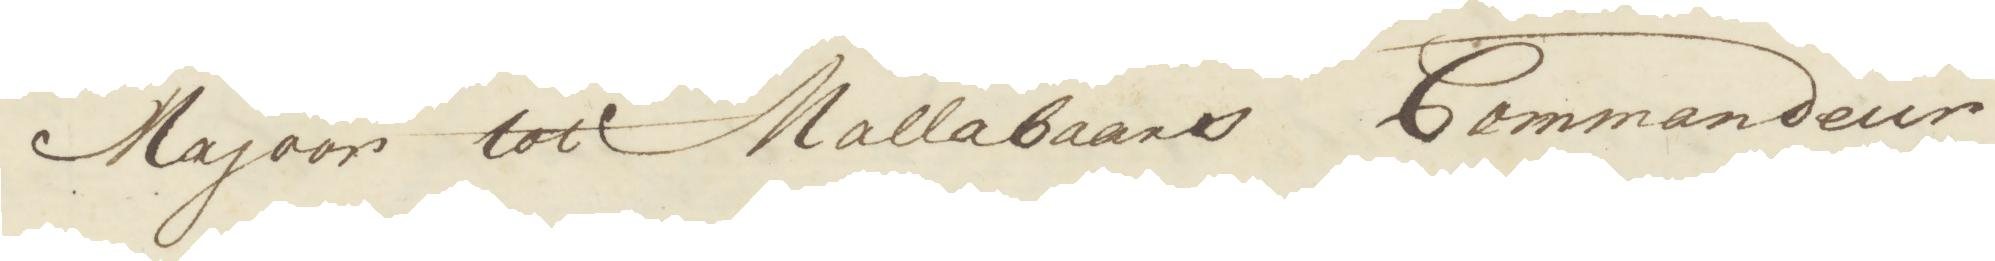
Majoor tot Mallabaars Commandeur
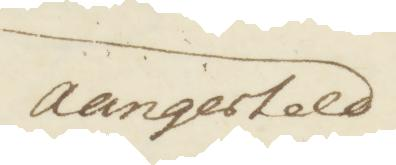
aangesteld
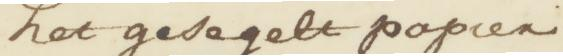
het gesegelt papier
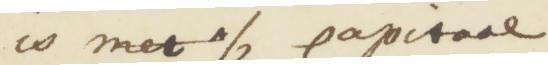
is met ½ capitaal
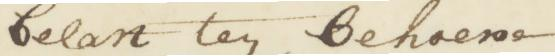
belast ten behoeve
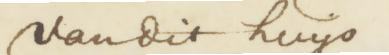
van dit huijs
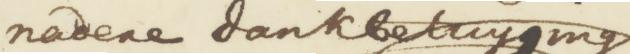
nadere dankbetuijging
